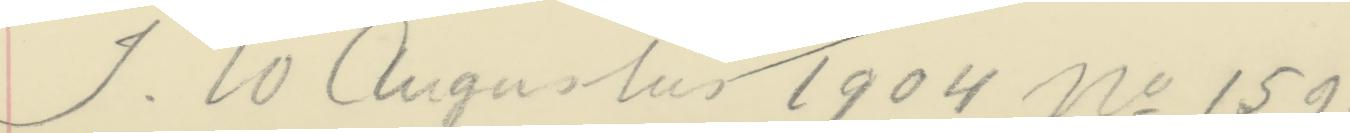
I. 10 Augustus 1904 N-o 159
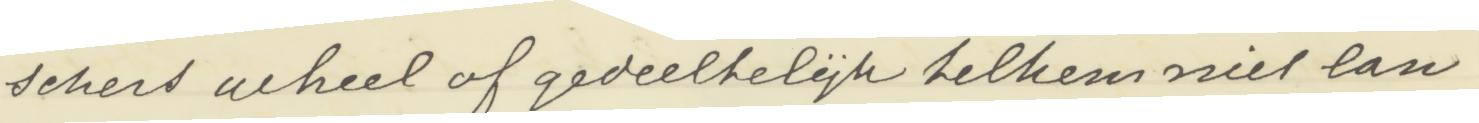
schers geheel of gedeeltelijk telkens niet lan
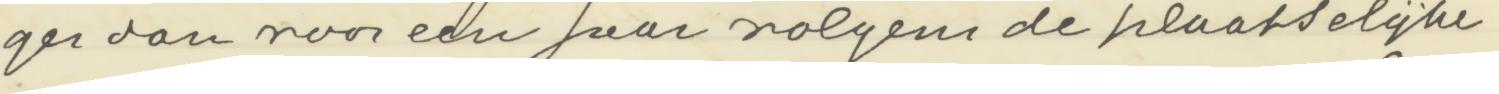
ger dan voor een jaar volgens de plaatselijke
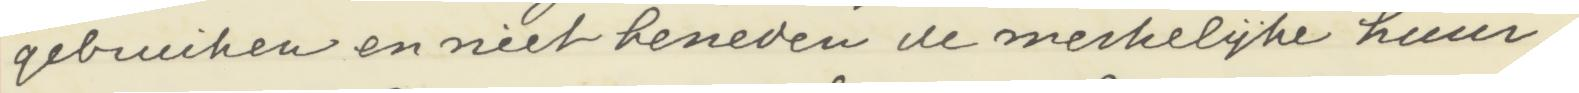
gebruiken en niet beneden de werkelijke huur
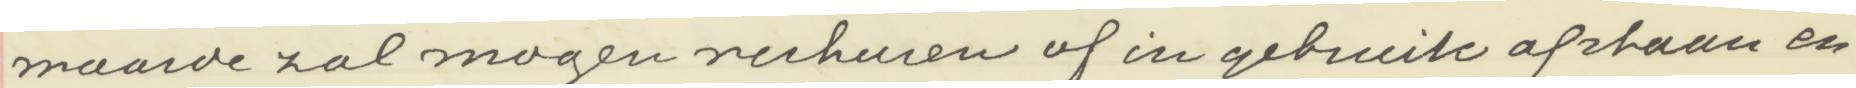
waarde zal mogen verhuren of in gebruik afstaan en
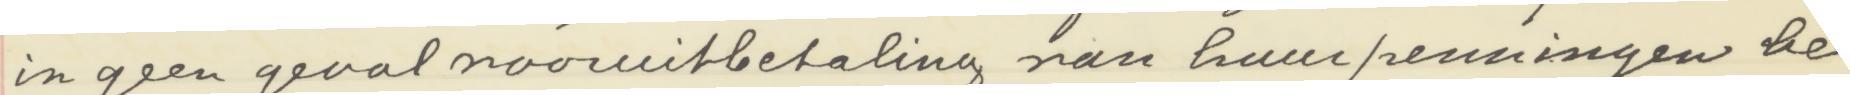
in geen geval vooruitbetaling van huurpenningen be
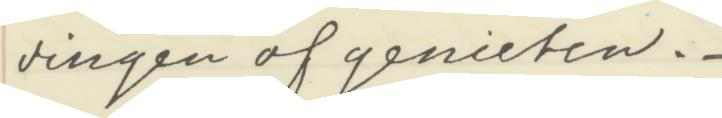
dingen of genieten.
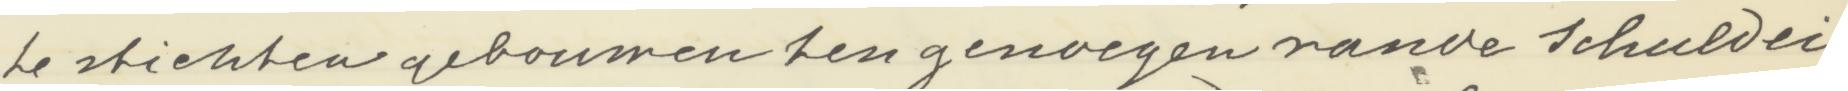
te stichten gebouwen ten genoegen vande schuldei
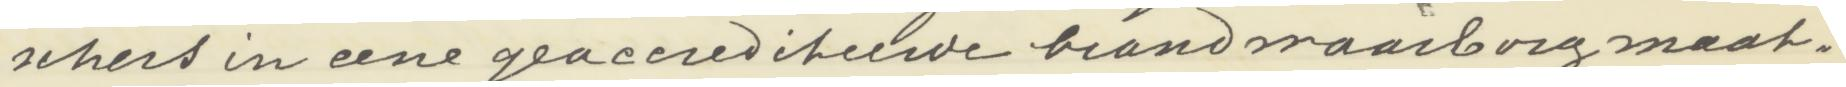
schers in eene geacccediteerde brand waarborg maat„
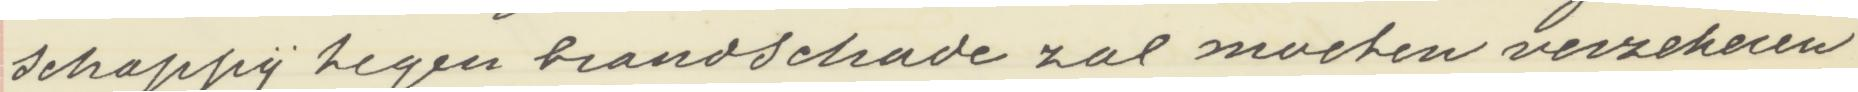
schappij tegen brandschade zal moeten verzekeren
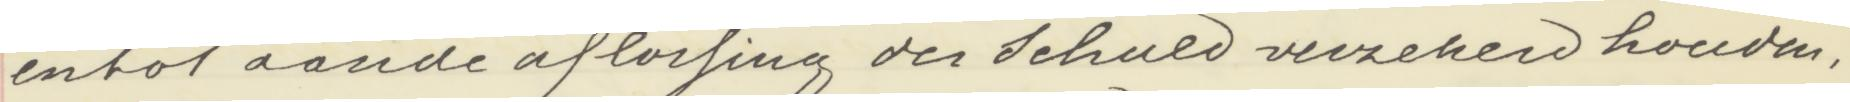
en tot aan de aflossing der schuld verzekerd houden,
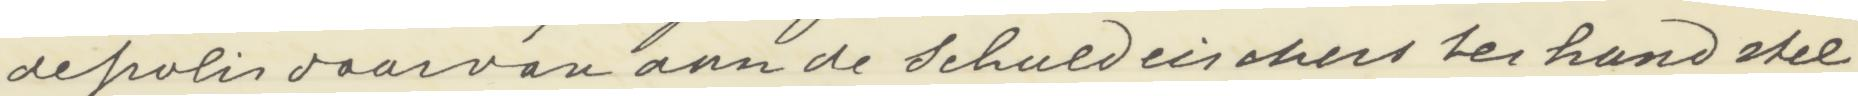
de polis daarvan aan de schuldeischers ten hand stel
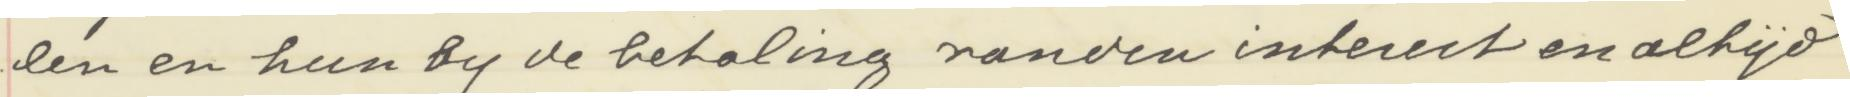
len en hun by de betaling van den interest en altijd
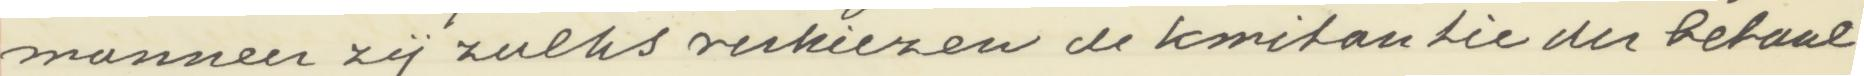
wanneer zij zulks verkiezen de kwitantie der betaal
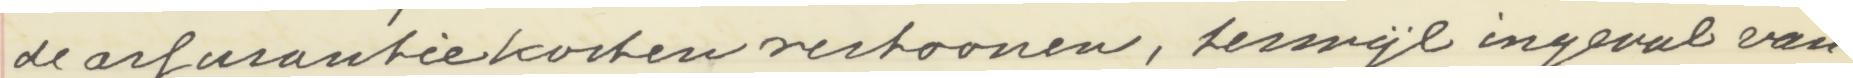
de assurantie kosten vertoonen, terwijl ingeval van
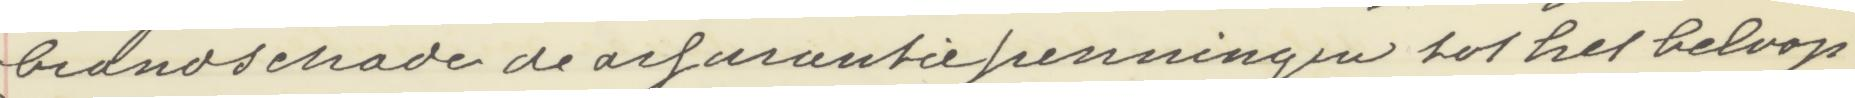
brandschade de assurantie penningen tot het beloop
